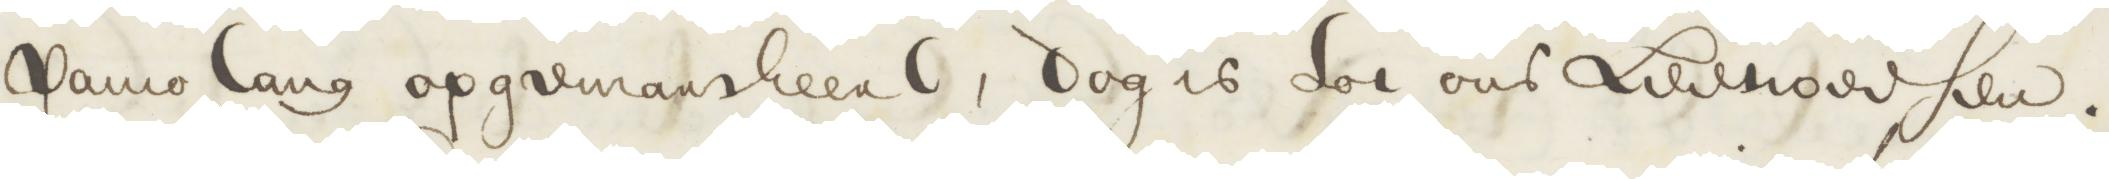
Pamo tang opgemarcheert, dog is tot ons leetweesen.
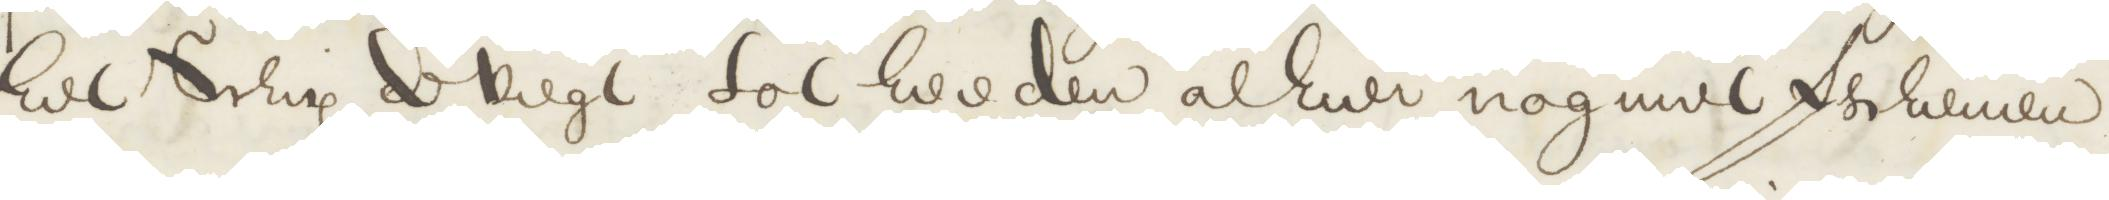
het schip de Vegt tot heeden alhier nog niet verschenen
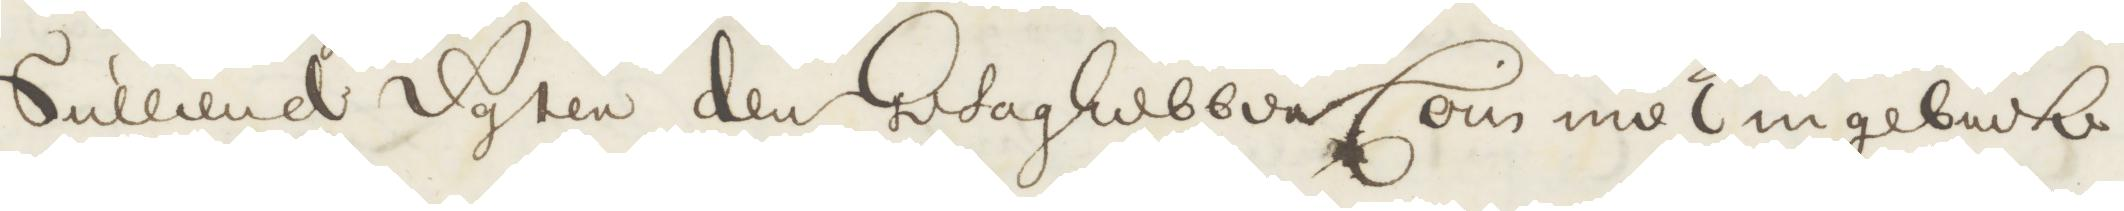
sullende Egter den Gesaghebber Coin niet in gebrek
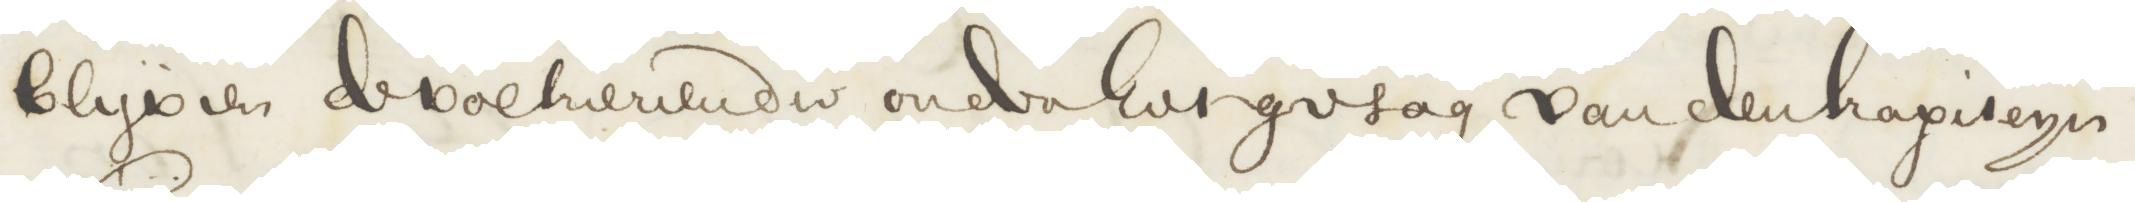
blijven de volkeren die onder het gesag van den kapiteijn
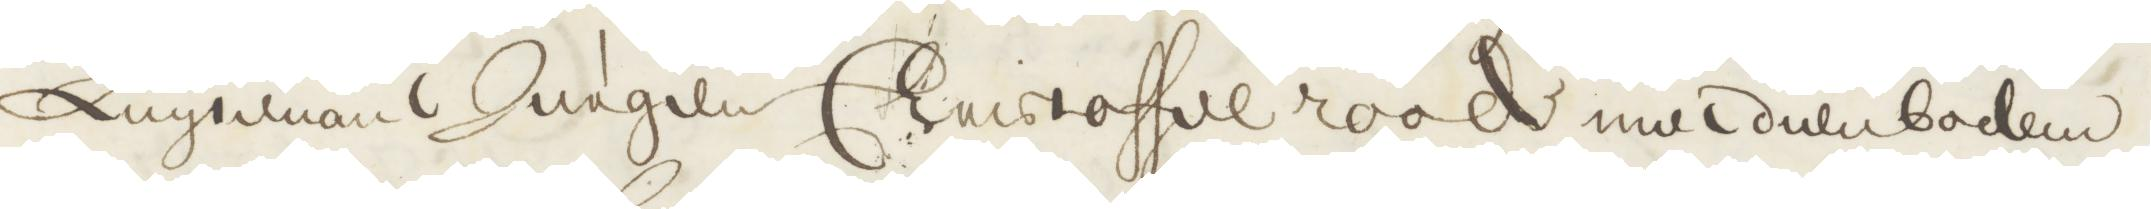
Luijtenant Jurgen Christoffel roode met dien bodem
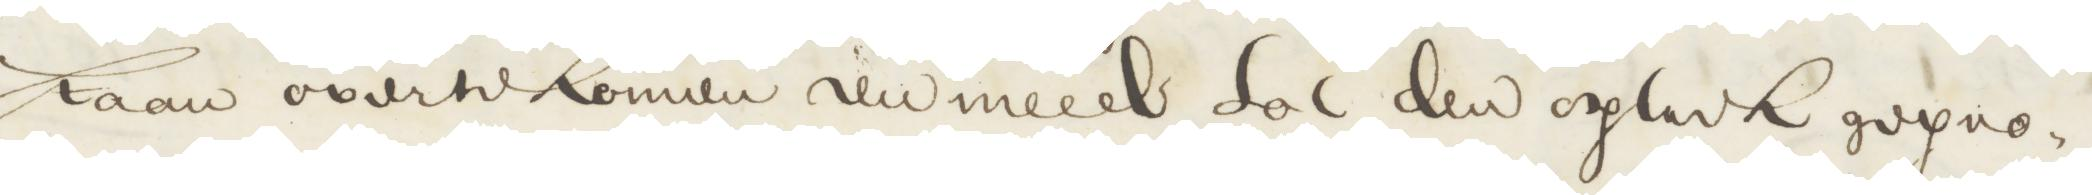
staan overtekomen en meede tot den optrek gepro„
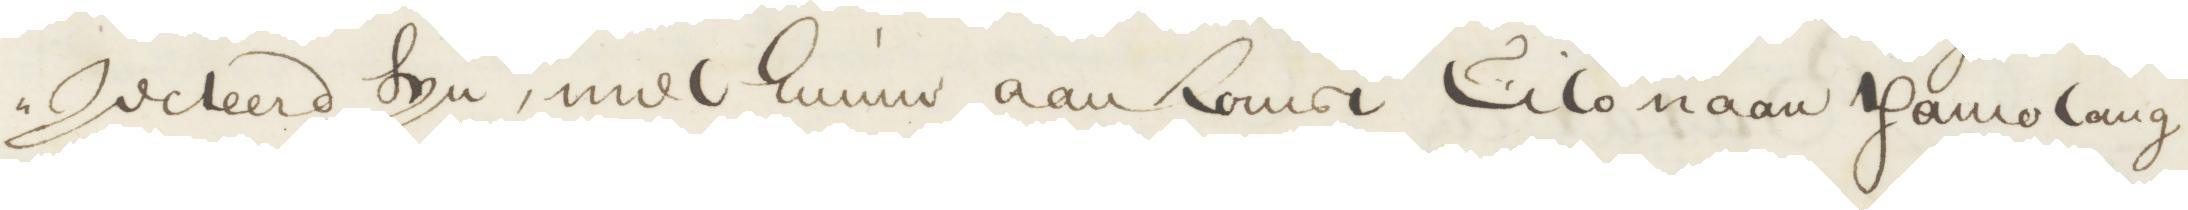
„jecteerd sijn, met hunne aankomst Cito naar Pamotang
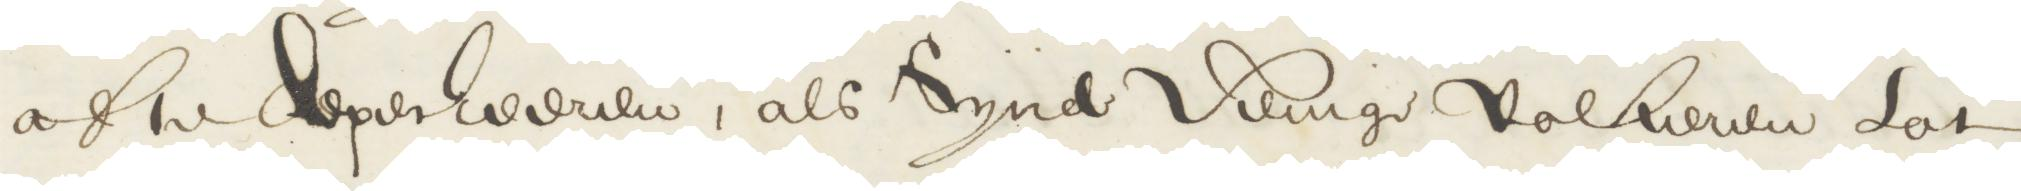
afte depecheeren, als sijnde Eenige volkeren tot
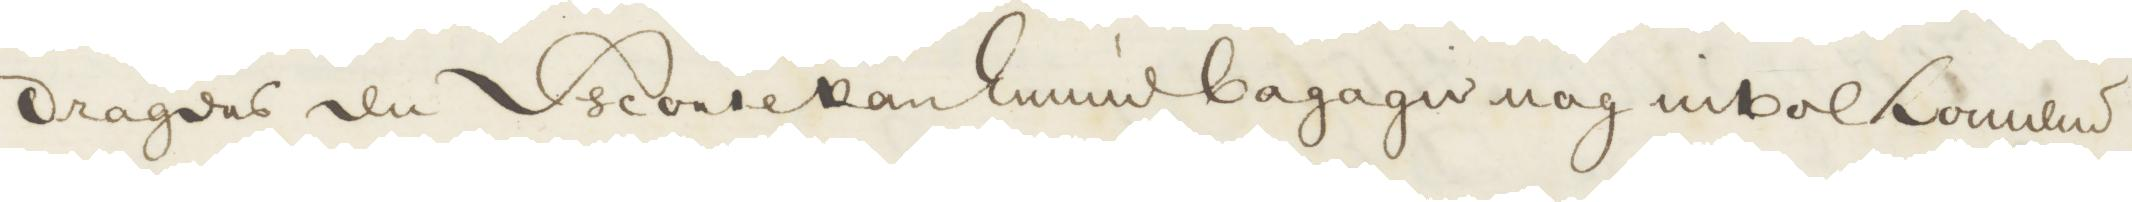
dragers en Escorte van hunne bagagie nog in volkomene
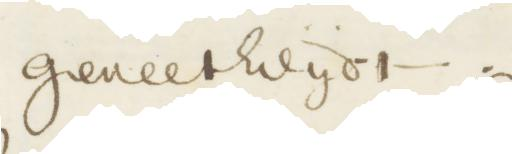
gereetheijdt.
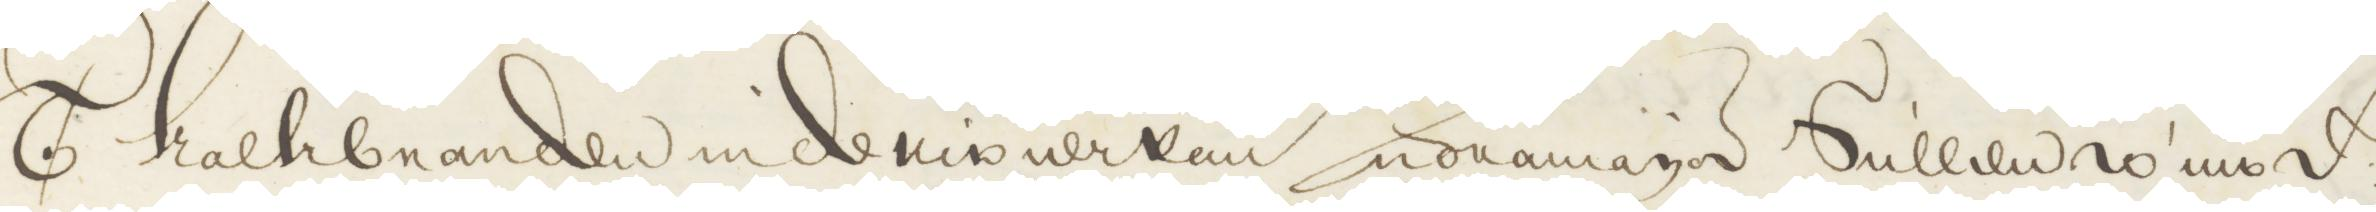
T kalkbranden in de rivier van jndramaija sullen w' uw E:
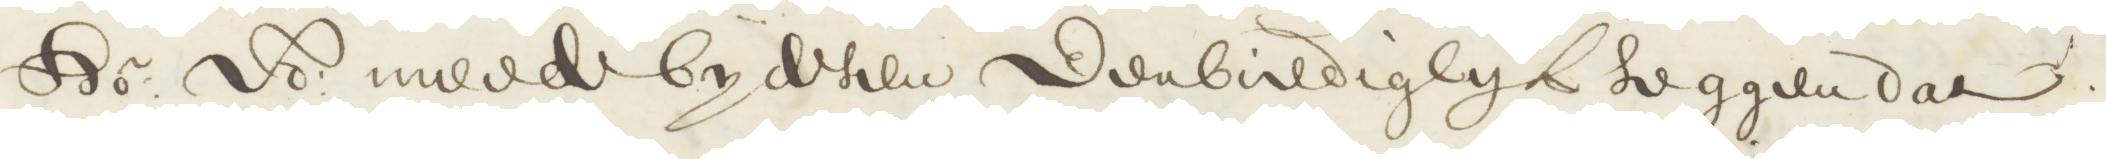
Hó: Ed: meede bij desen Eerbiediglijk seggen dat
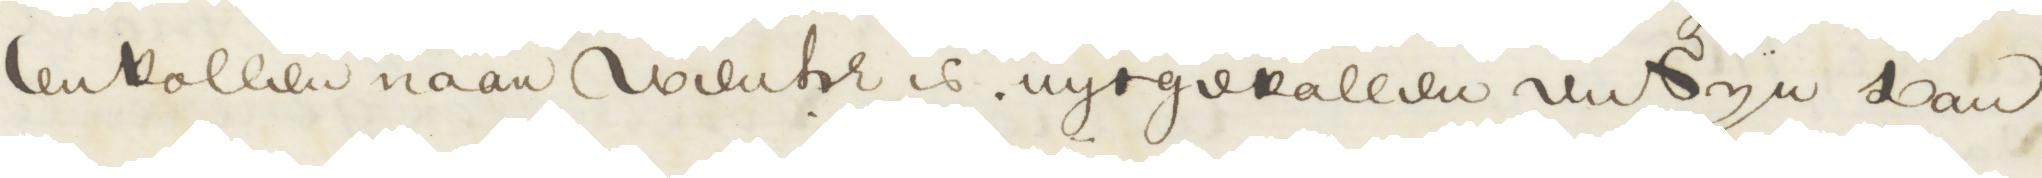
ten vollen naar wensch is. uijtgevallen en sijn van
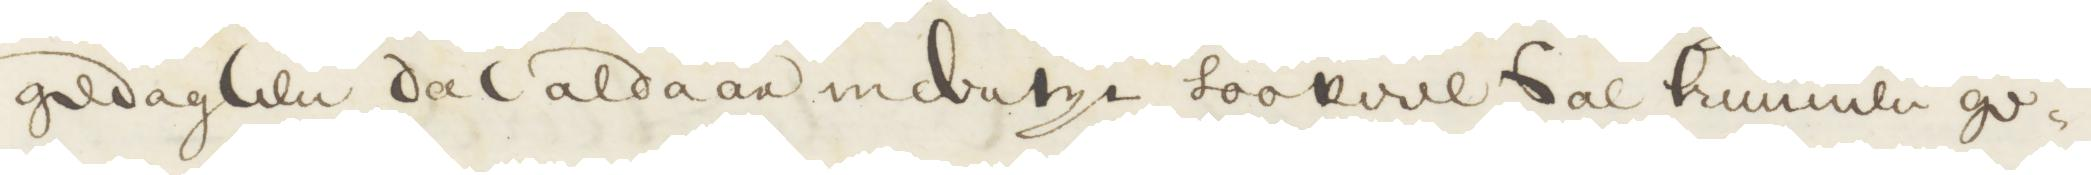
gedagten dat aldaar inder tijt soo veel sal kunnen ge„
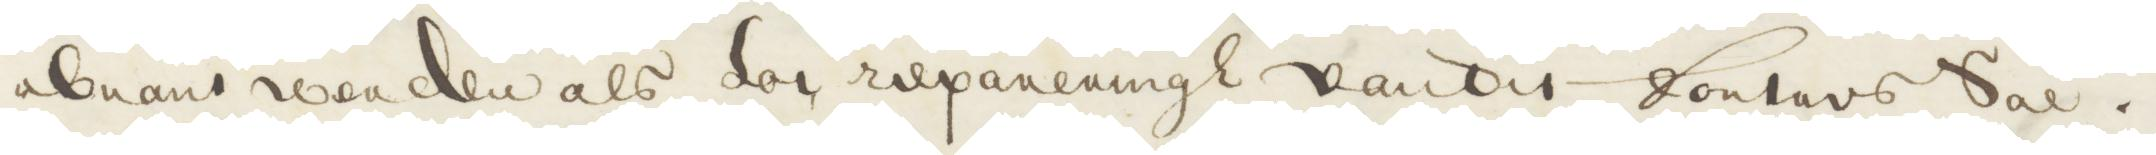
brant werden als tot repareringh van dit fortres sal.
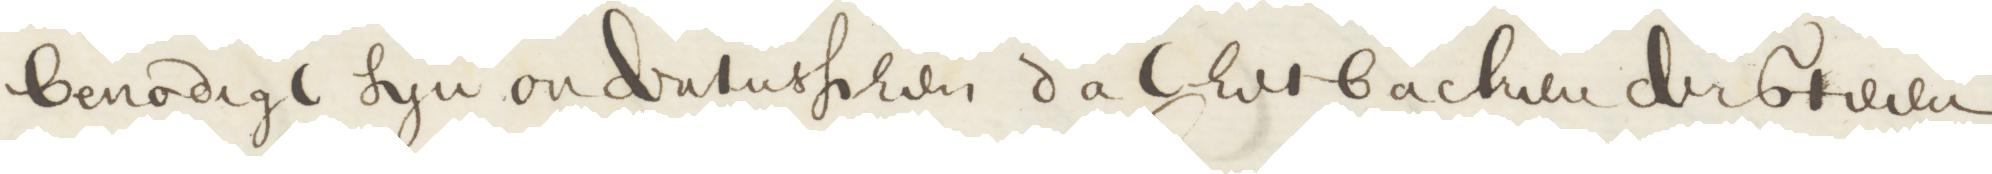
benodigt sijn ondertusschen dat het backen der steen
